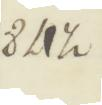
84½
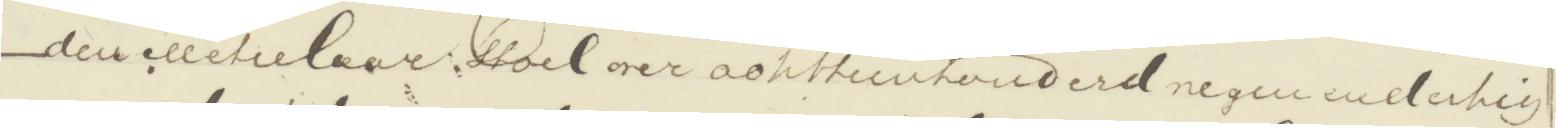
den metselaar Hoel over achttienhonderd negen en dertig
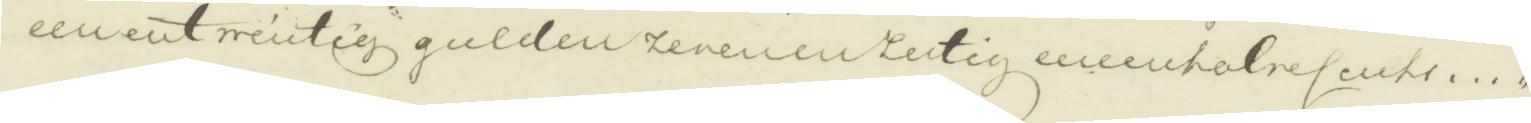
een en twintig gulden zevenenzestig eneenhalve Cents . . . „
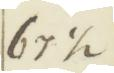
67½
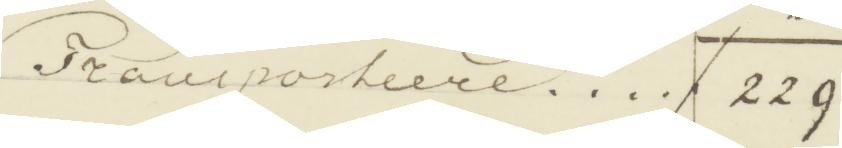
Transporteere . . . . ƒ 229
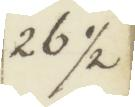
26½
